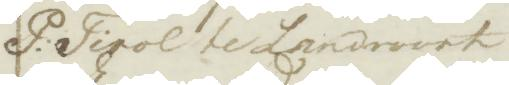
P: Tirol te Zandvoort
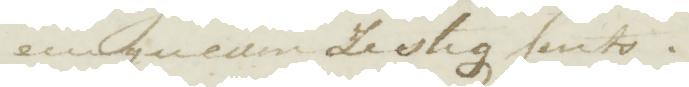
een gulden Zestig Cents. . . . .
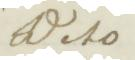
Dito . . . . . . . . . . . .
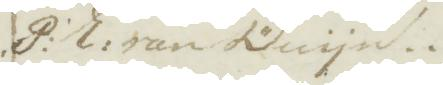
P:E: van Duijn. . . . .
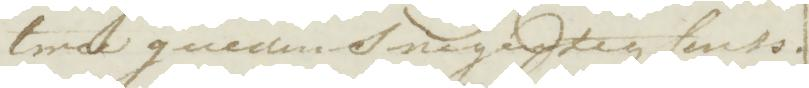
twee guldens negentig Cents.
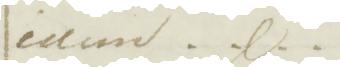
idem. . . . . . . . . .
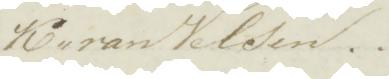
K„ van Velsen . . . . . . .
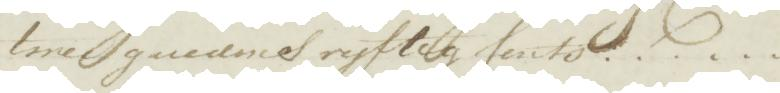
twee guldens vyftig Cents . . . . . . .
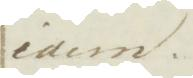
idem. . . . . . . . . . . . .
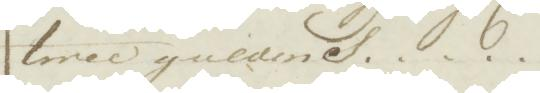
twee guldens . . . . .
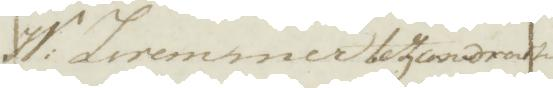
W. Zwemmer te Zandvoort
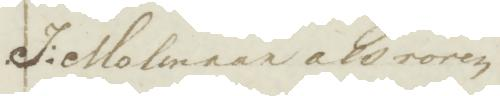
J: Molenaar als voren
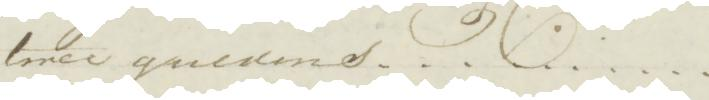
twee guldens. . . . . . .
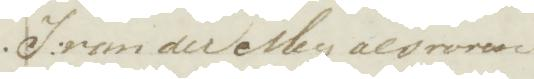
J. van der Mey als voren
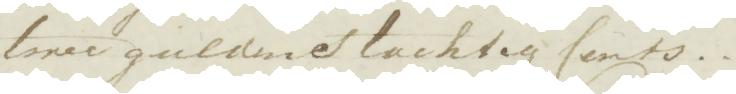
twee guldens tachtig Cents. . . . .
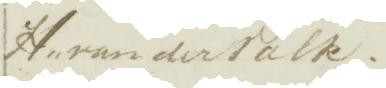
H„ van der Valk. . . . . .
